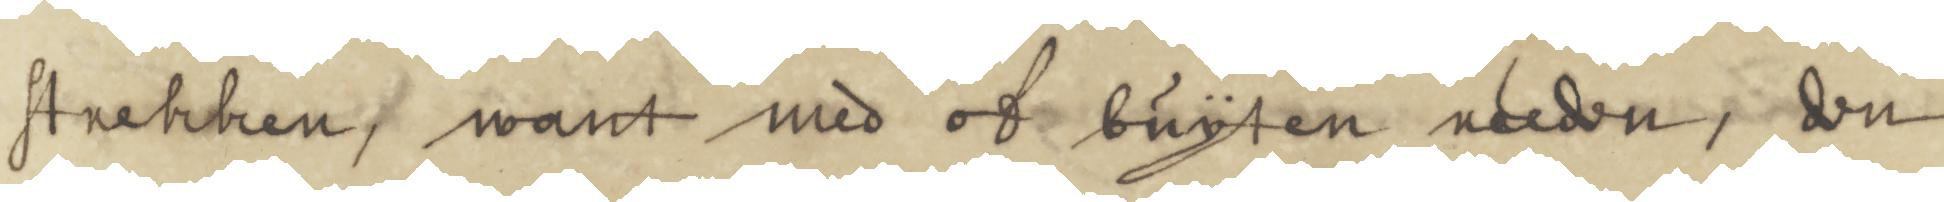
strekken, want med of buijten reeden, den
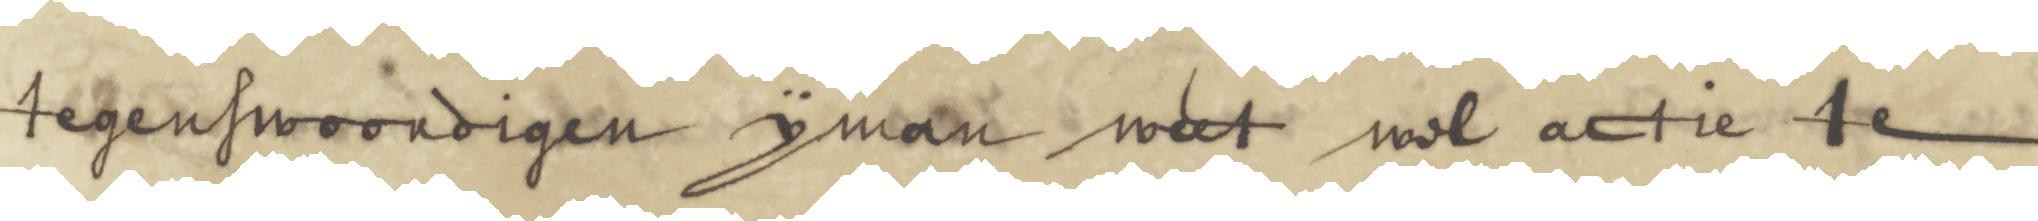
tegenswoordigen ijman weet wel actie te
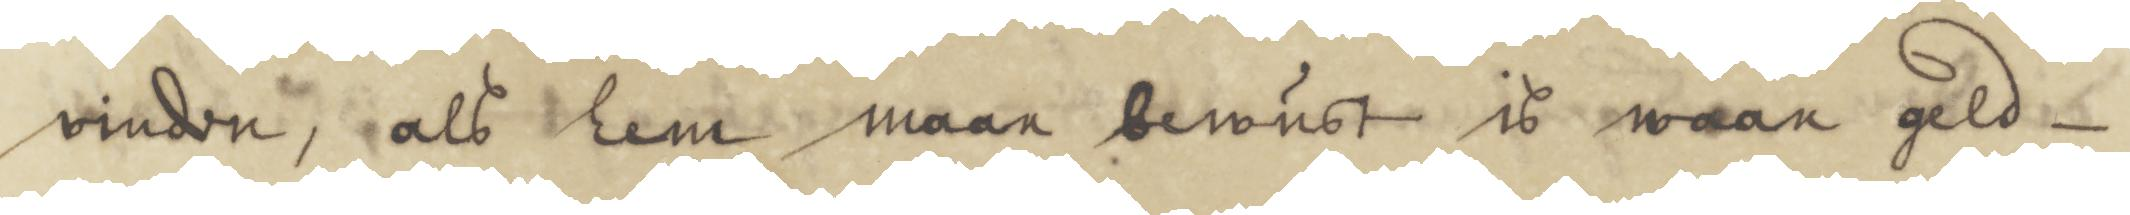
vinden, als hem maar bewust is waar geld —
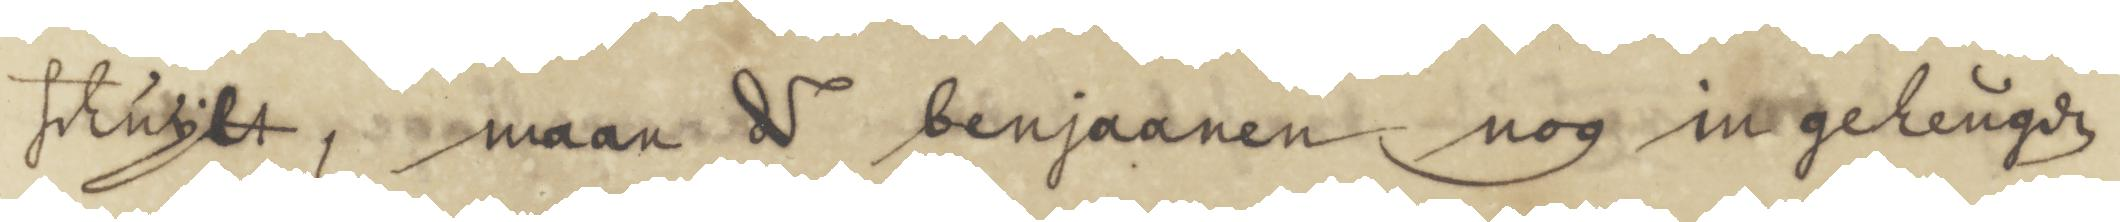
schuijlt, maar de benjaanen nog in geheugen
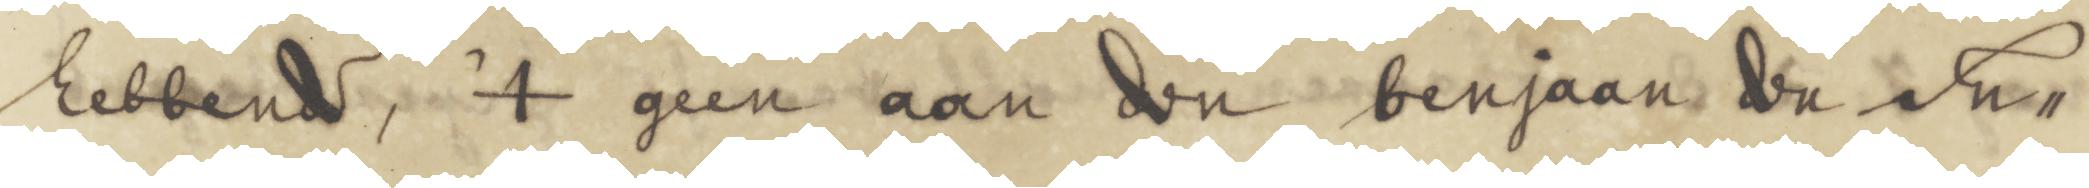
hebbende, ’t geen aan den benjaan der En„
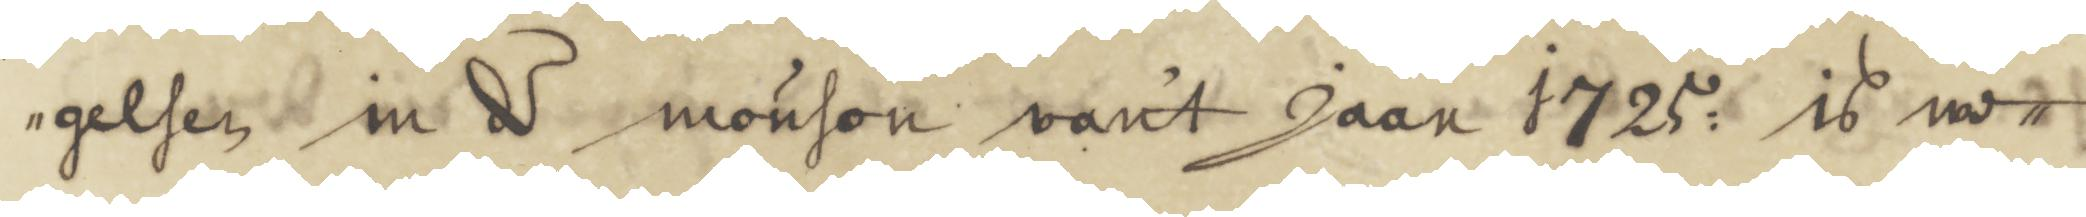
„gelsen in de mouson van’t jaar 1725: is we„
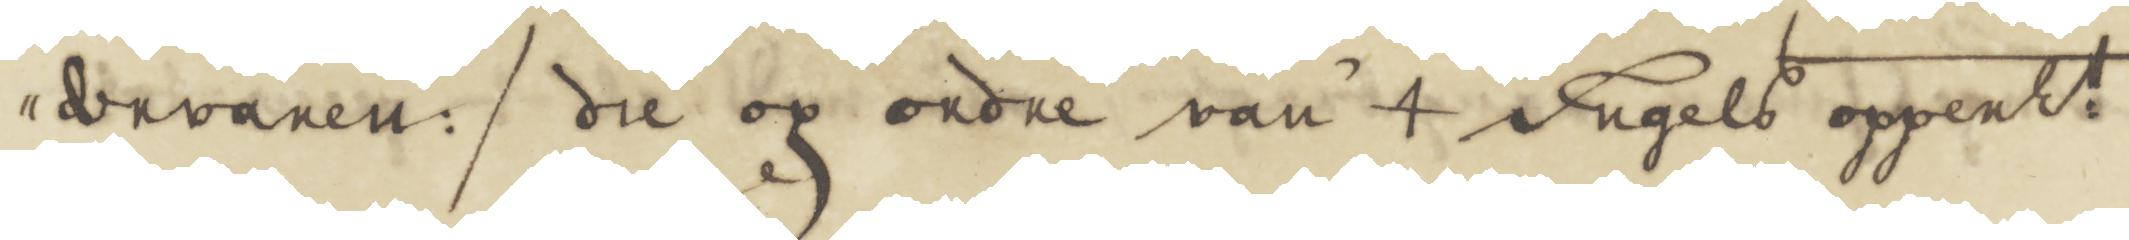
„dervaren:/ die op ordre van ’t Engels opperh:t
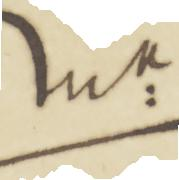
m:r
